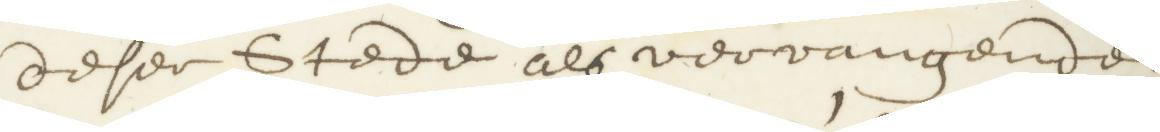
deser Stede als vervangende
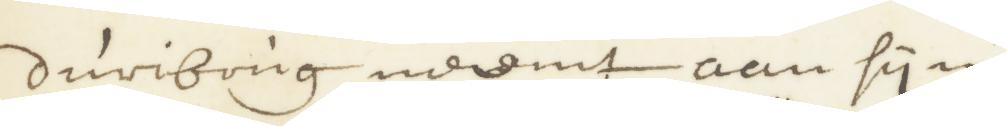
duribrug neemt aan sijn
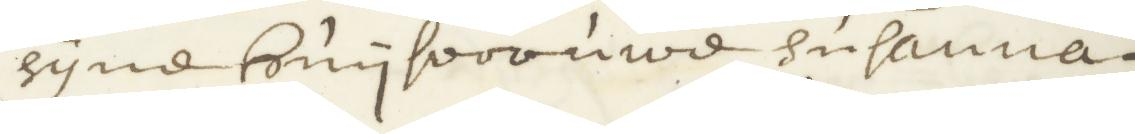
sijne huijsvrouwe susanna —
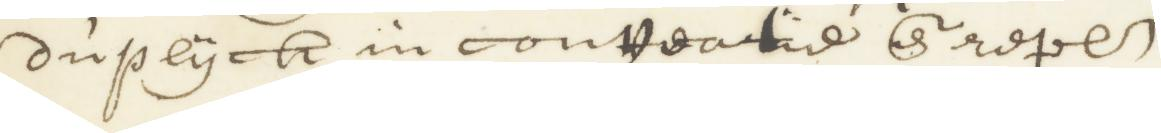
duplijck in conventie ende replijk
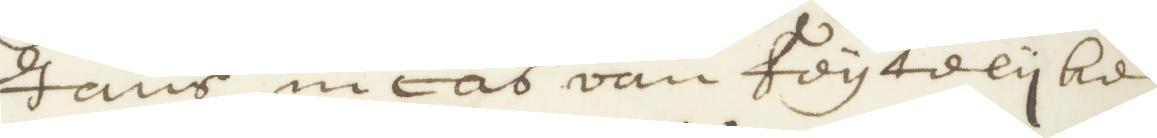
Ians in cas van Feijtelijke
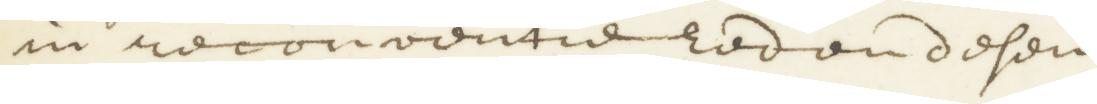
in reconventie heden desen
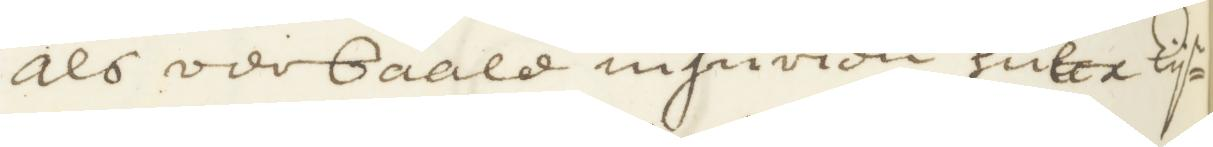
als verbaale injurien sulcx Eij=r
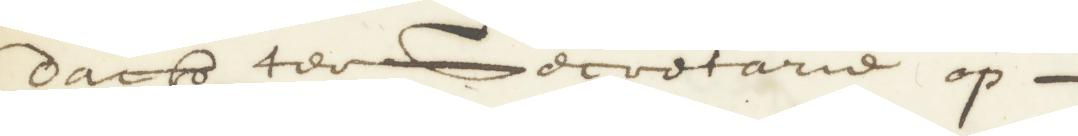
dach ter Secretarie op —
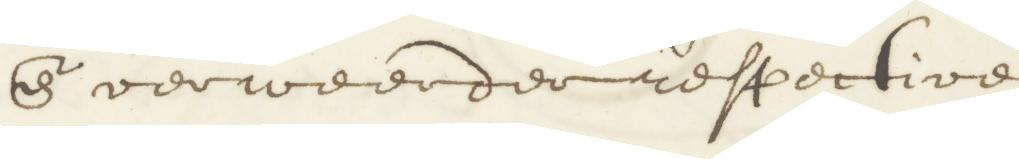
ende verweerder respective
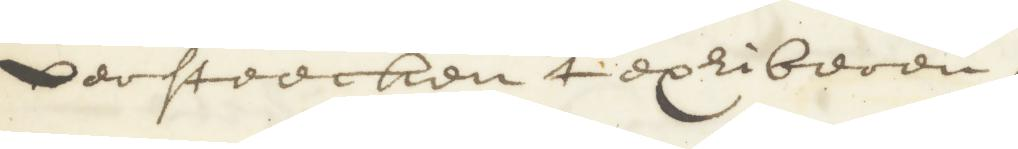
versteecken 't exhiberen,
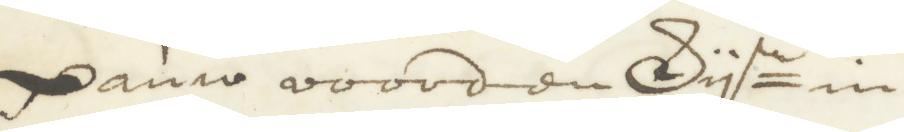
pauw voorden Eij=r in
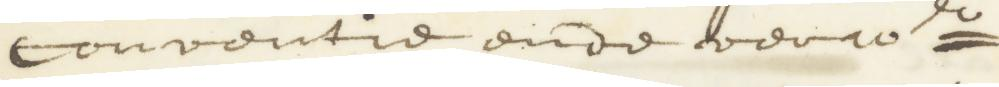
conventie ende verw=r
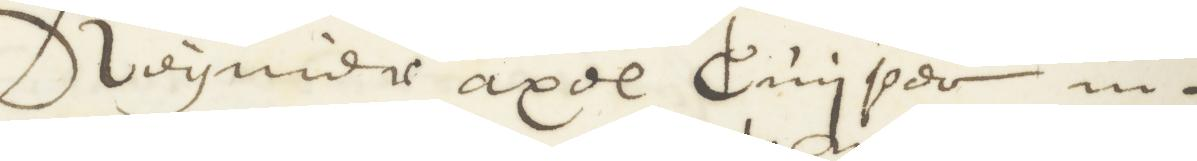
Reijnier axel Cuijper in —
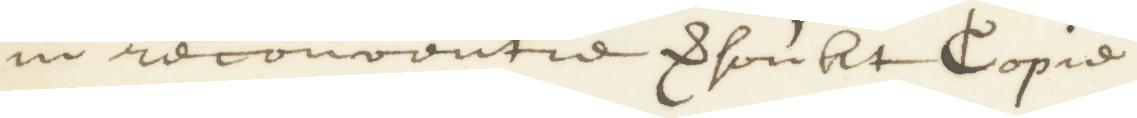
in reconventie versoukt Copie
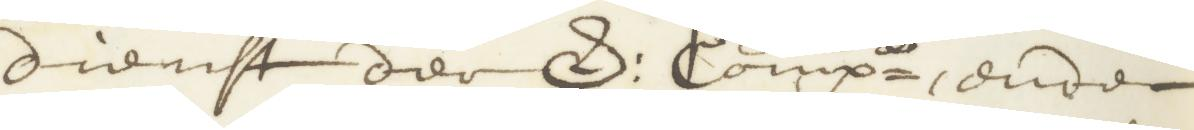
dienst der E: Comp=e, ende —
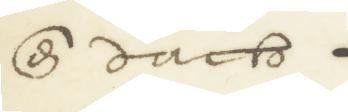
ende dach —
